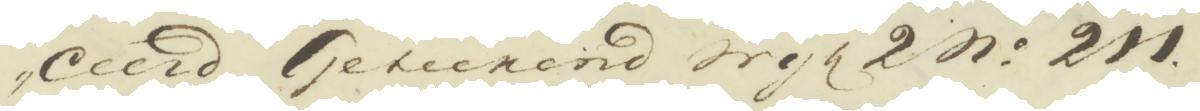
„ceerd Geteekend wyk 2 N.o 211.
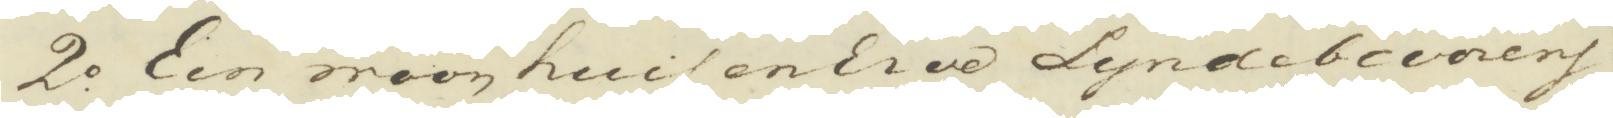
2.o Een woonhuis en Erve Zynde bevorens
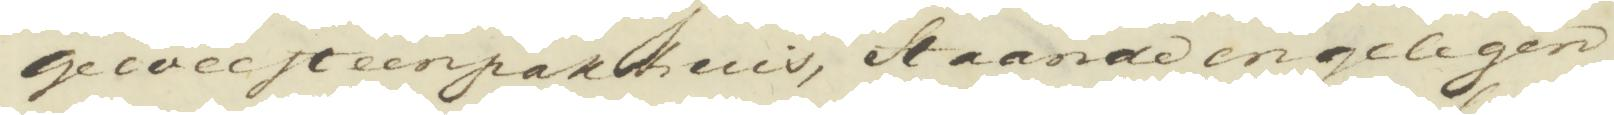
geweest een pakhuis, staande en gelegen
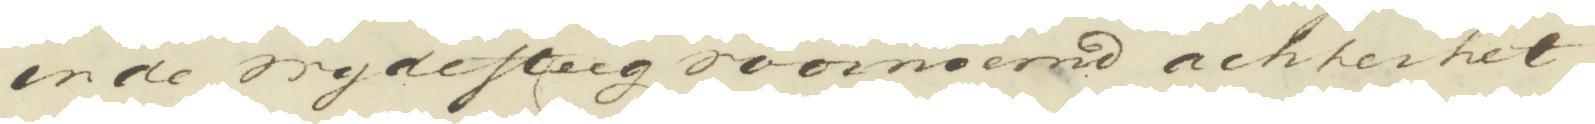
in de wydesteeg voornoemd achter het
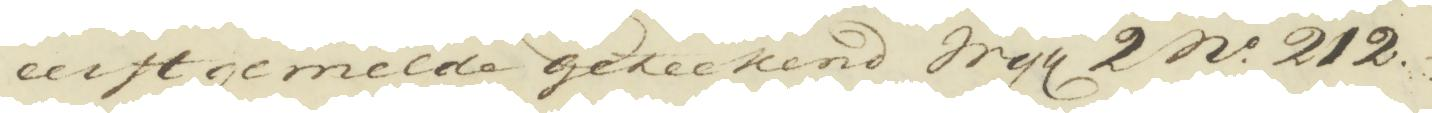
eerst gemelde geteekend Wyk 2 N.o 212.
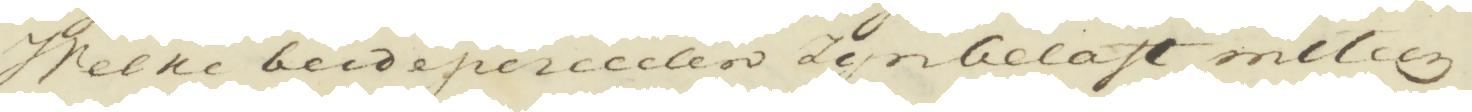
Welke beide perceelen zijn belast met een
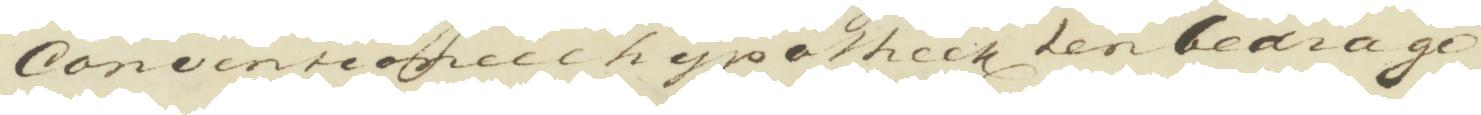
Conventioneel hypotheek ten bedrage
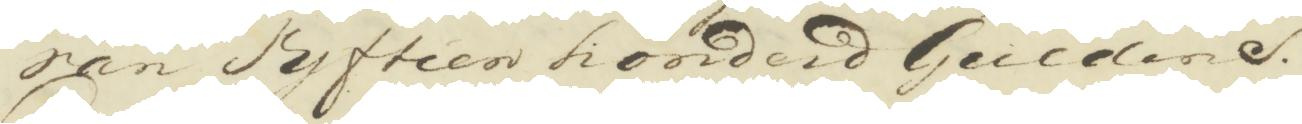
van Vyftien honderd Guldens.
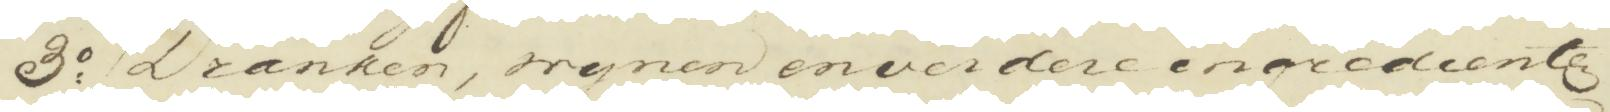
3.o Dranken, wynen en verdere ingredienten
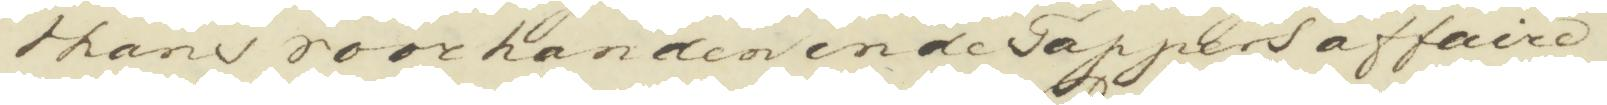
thans voorhanden in de Tappers affaire
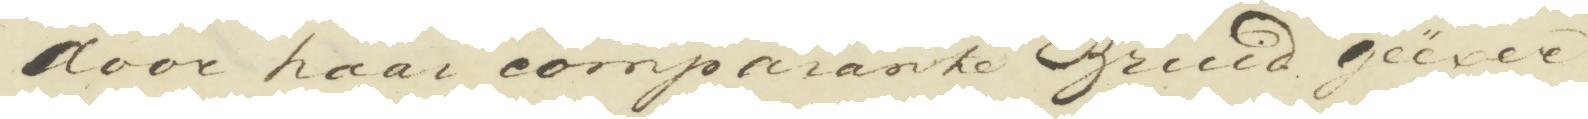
door haar comparante Bruid geëxer
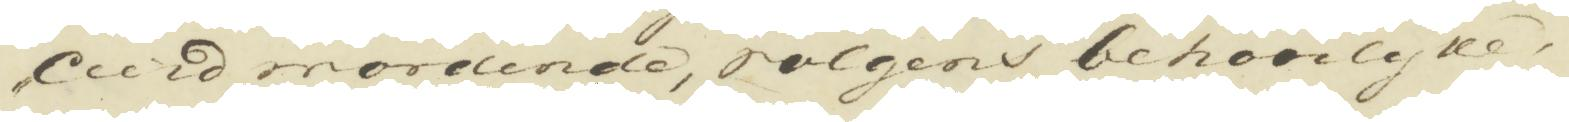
„ceerd wordende, volgens behoorlyke,
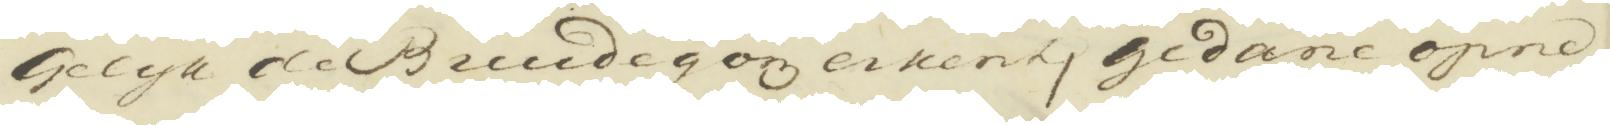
gelyk de Bruidegom erkent, gedane opne
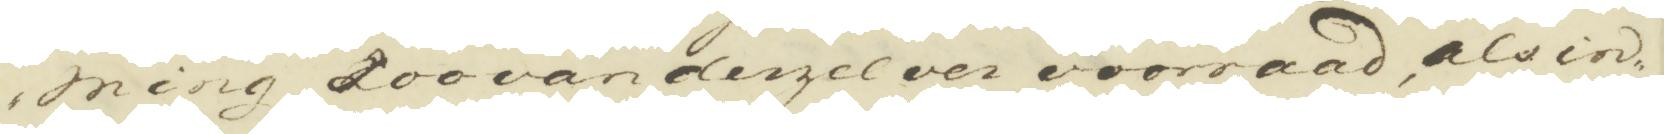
„ming zoo van derzelver voorraad, als in„
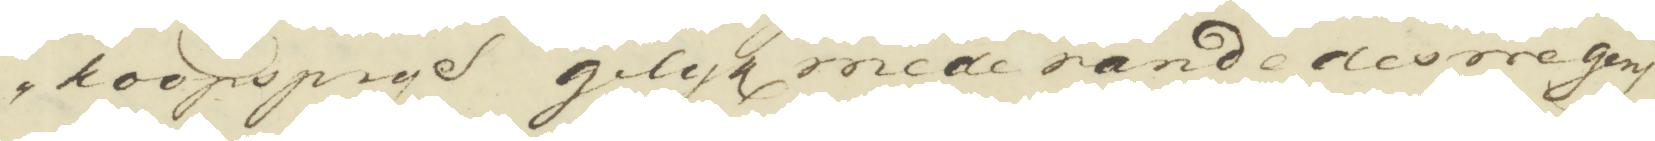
„koopsprys gelijk mede van de deswegens
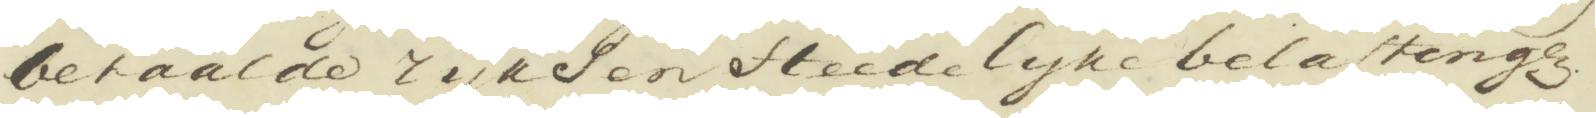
betaalde rijks en steedelyke belastingen
